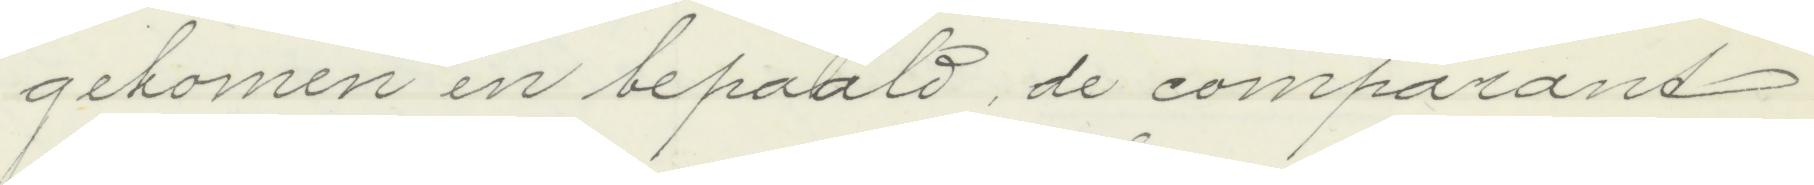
gekomen en bepaald, de comparant
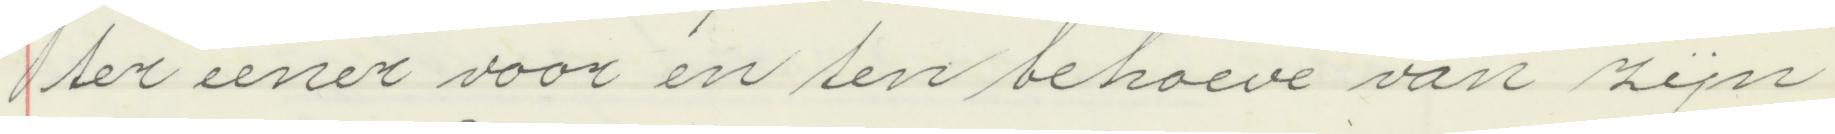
ver eener voor en ten behoeve van zijn
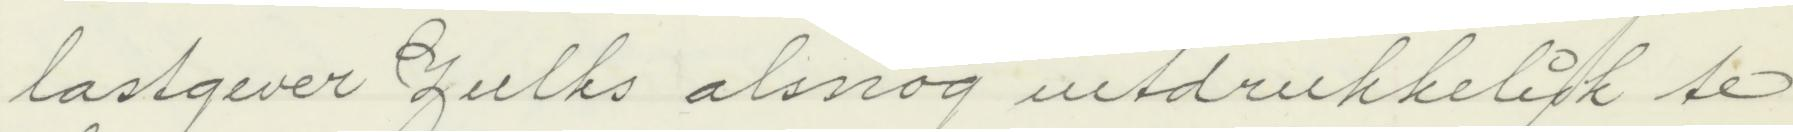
lastgever zulks als nog uitdrukkelijk te
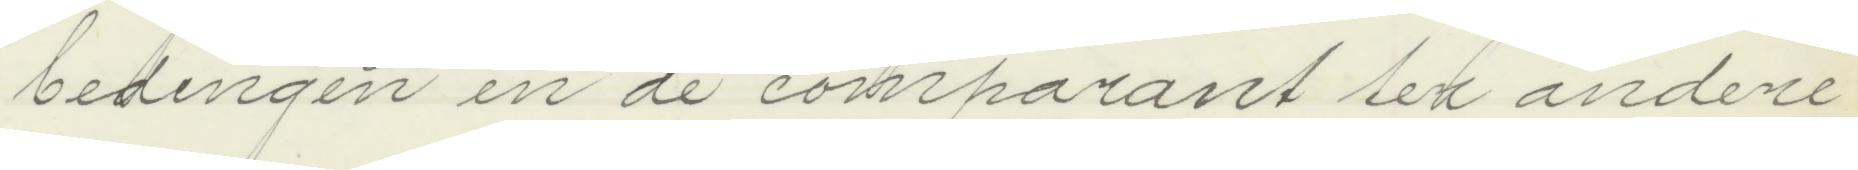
bedingen en de comparant ter andere
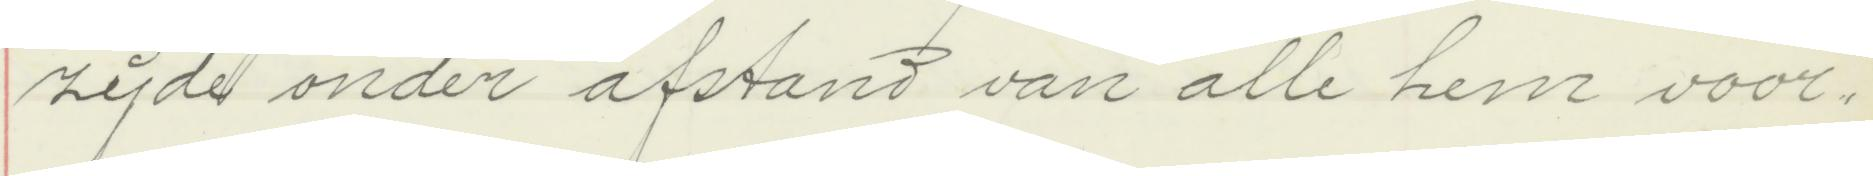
zijde onder afstand van alle hem voor„
